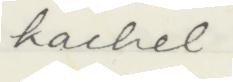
kachel
